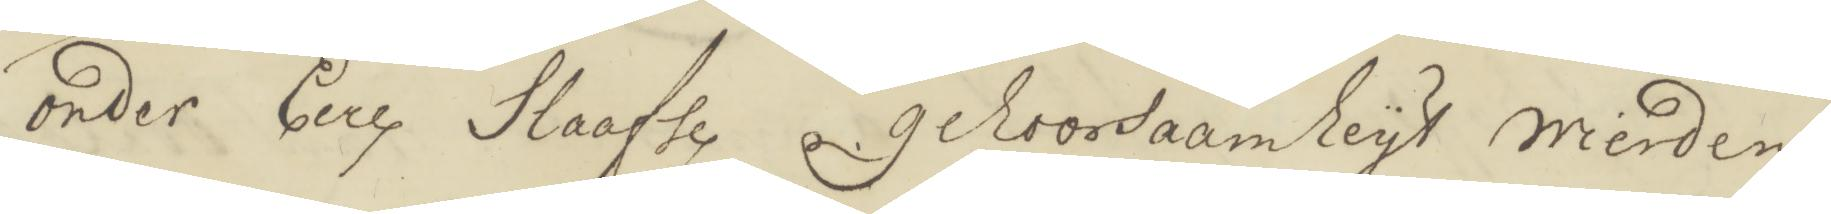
onder Eere slaafse gehoorsaamheijt wierden
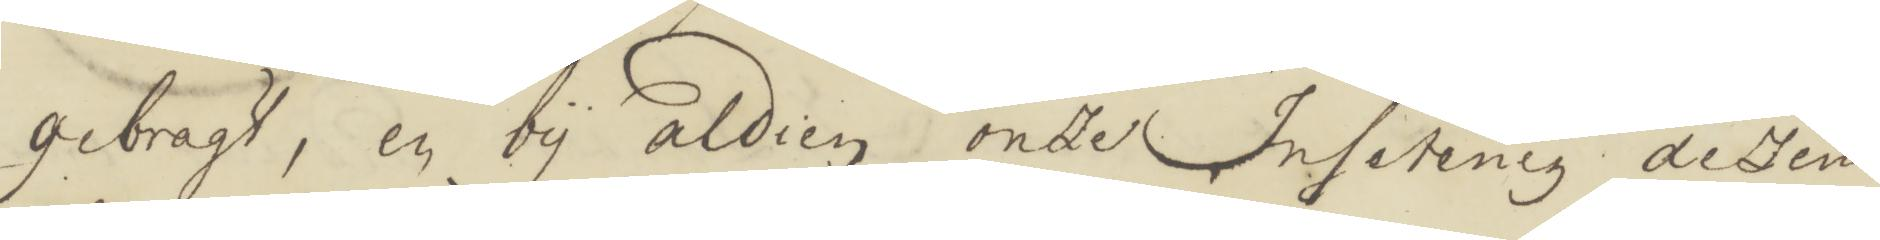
gebragt, en bij aldien onze Insetenen dezen
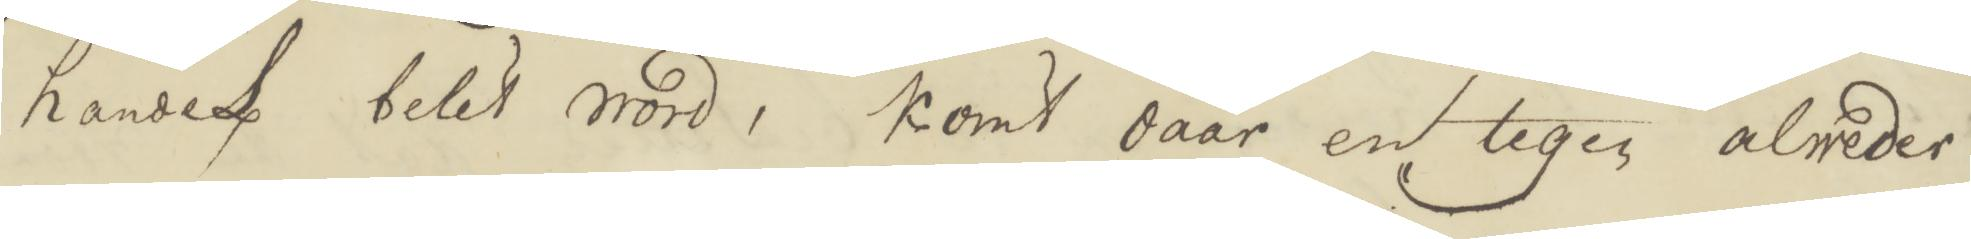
handel belet word, komt daar en tegen alweder
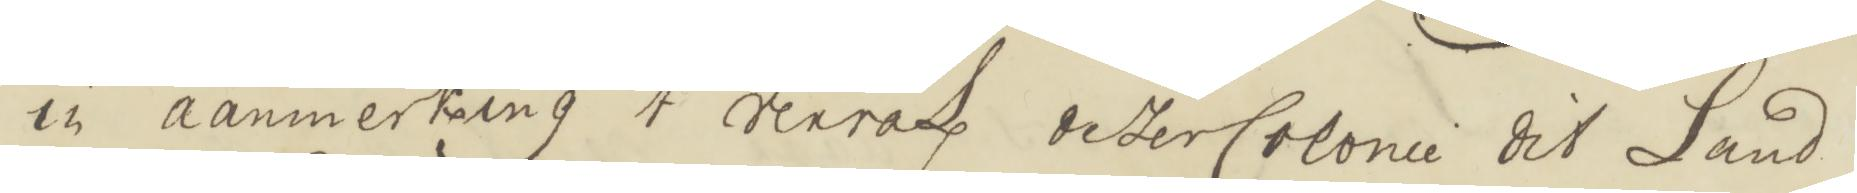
in aanmerking ’t verval dezercolonie dit Land
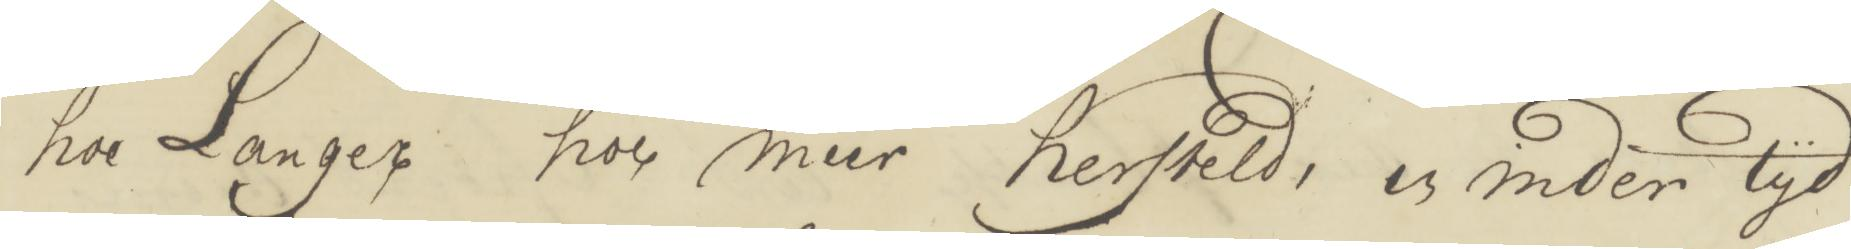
hoe Langer hoe meer hersteld, en inder tijd
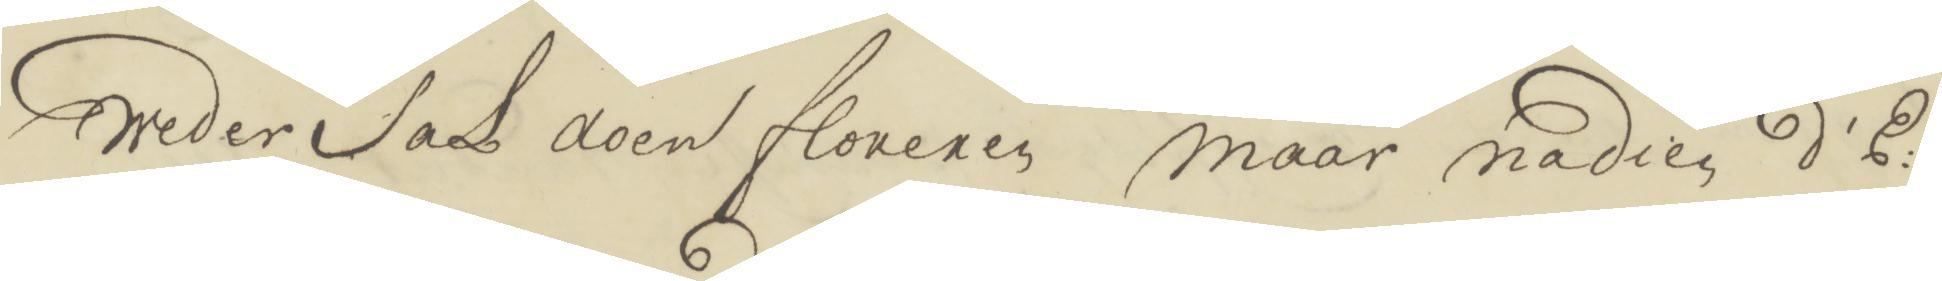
weder sal doen floreren maar nadien d’E:
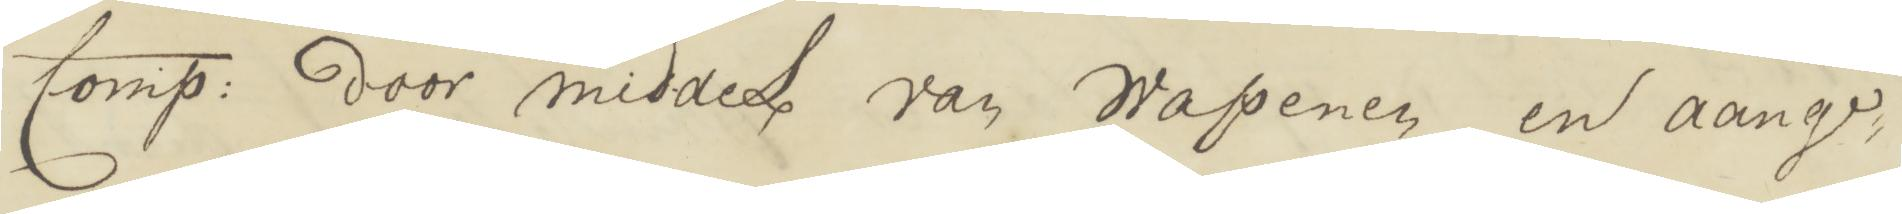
Comp: door middel van wapenen en aange„
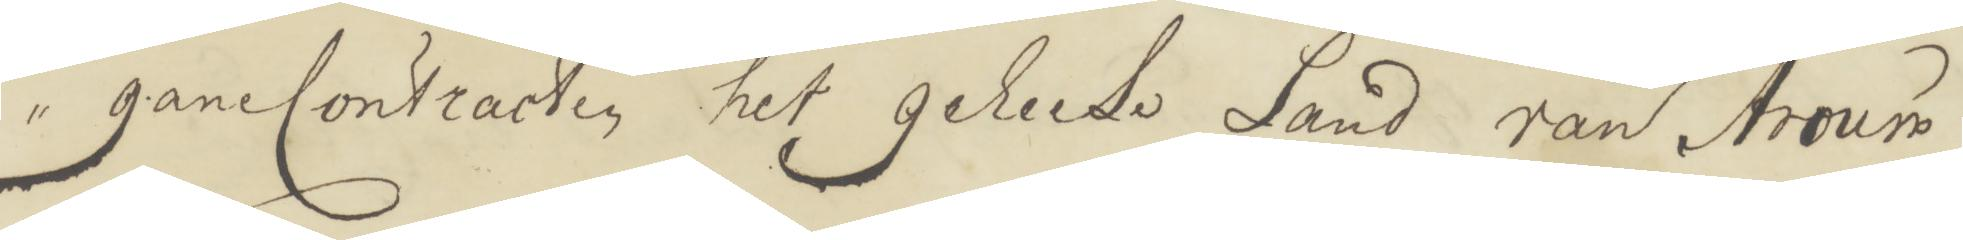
„gane contracten het geheele Land van Arouw
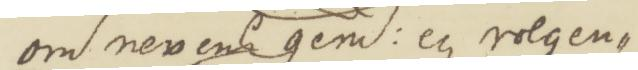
om nevens gem: en volgen„
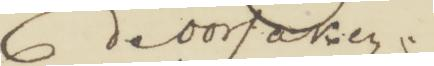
de oorsaken.
